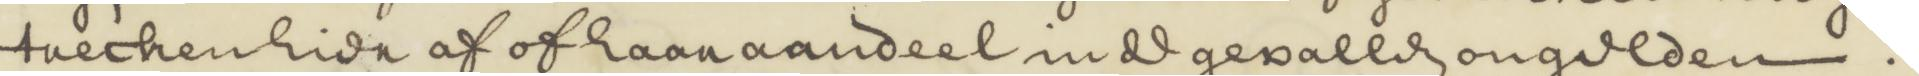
trecken hier af of haar aandeel in de gevallen ongelden .
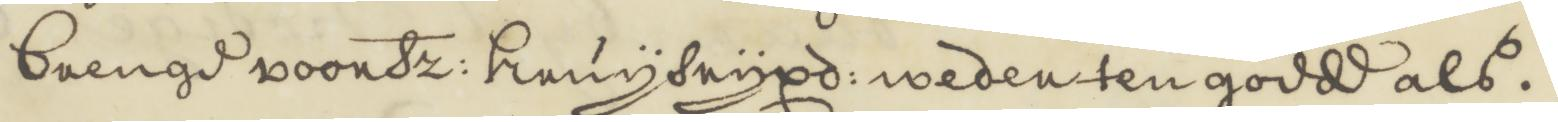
brenge voorsz: kruijsrijxd: weder ten goede als.
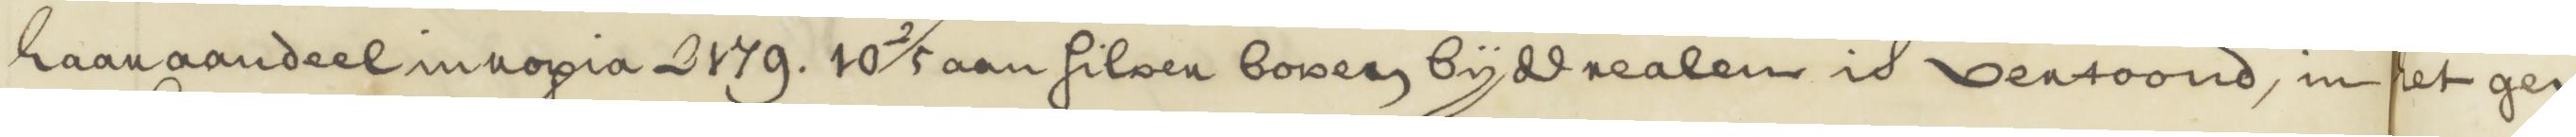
haar aandeel in ropia 2179. 10 2/5 aan silver boven bij de realen is vertoond, in het ge
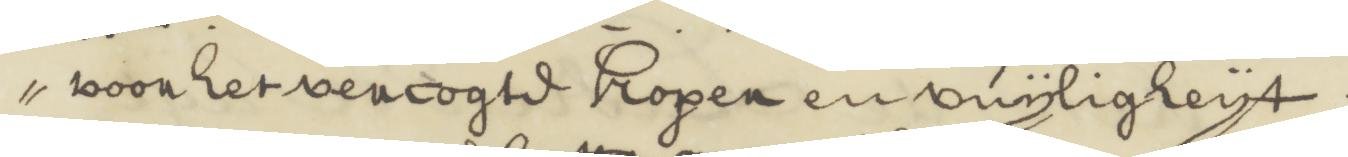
„ „ voor het vercogte koper en vuijligheijt
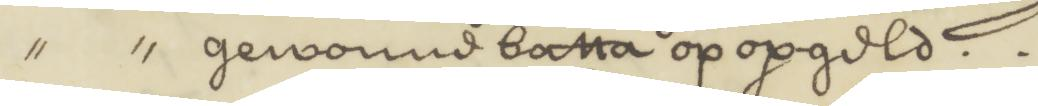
„ „ „ gewonne batta op opgeld .
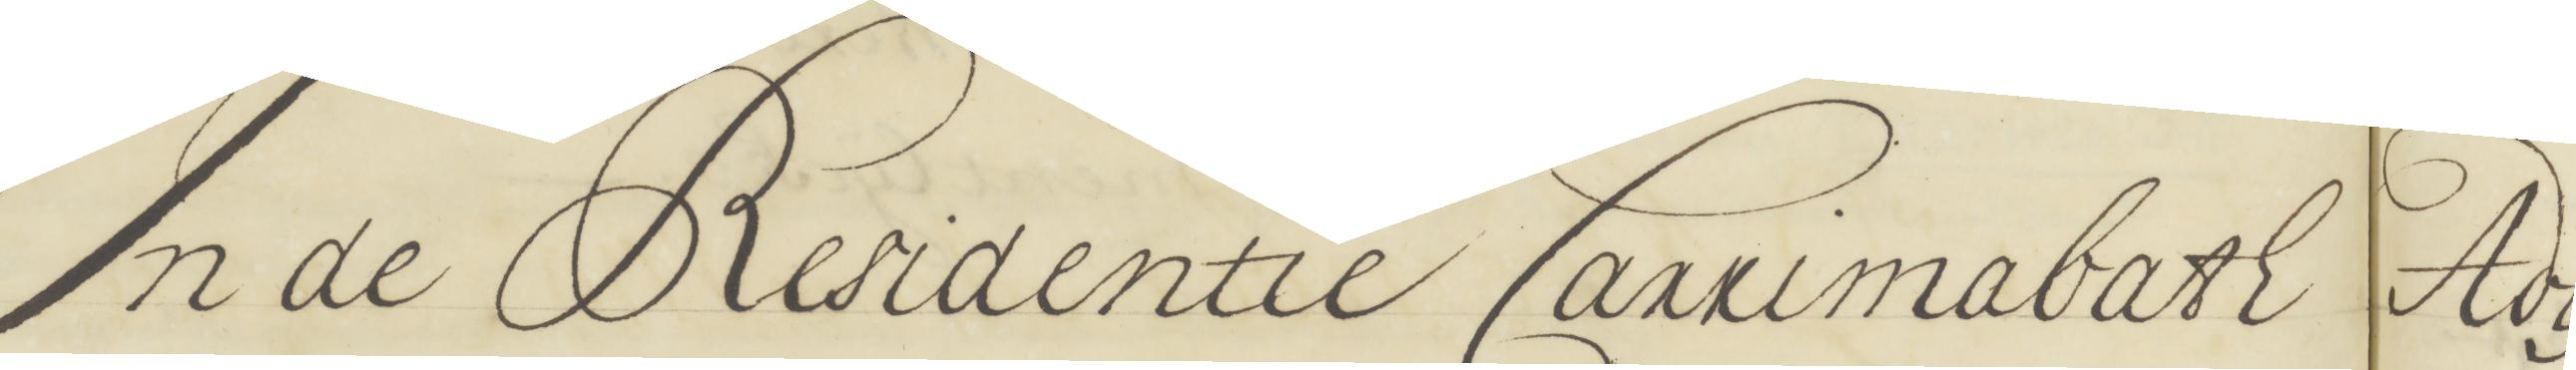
In de Residentie Carrimabath Ad
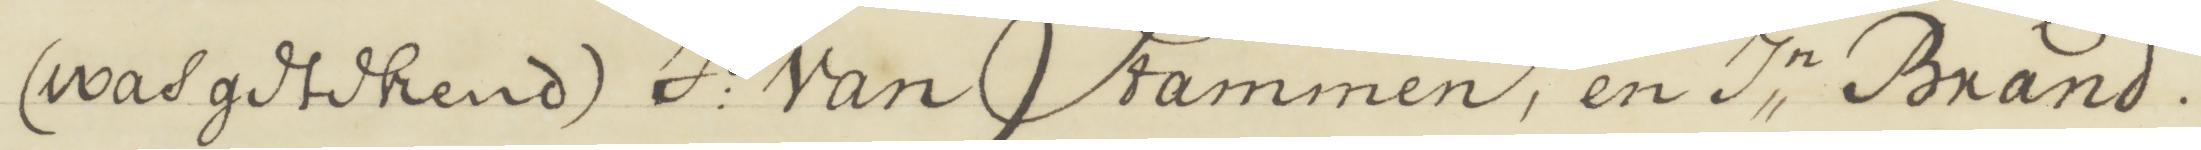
(was getekend) I:b van Stammen, en I„n Brand.
